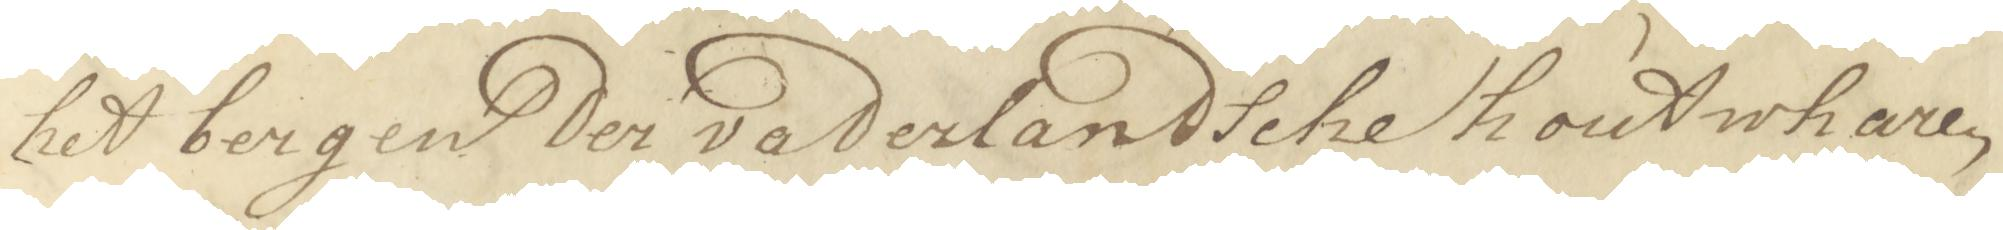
het bergen der vaderlandsche houtwharen
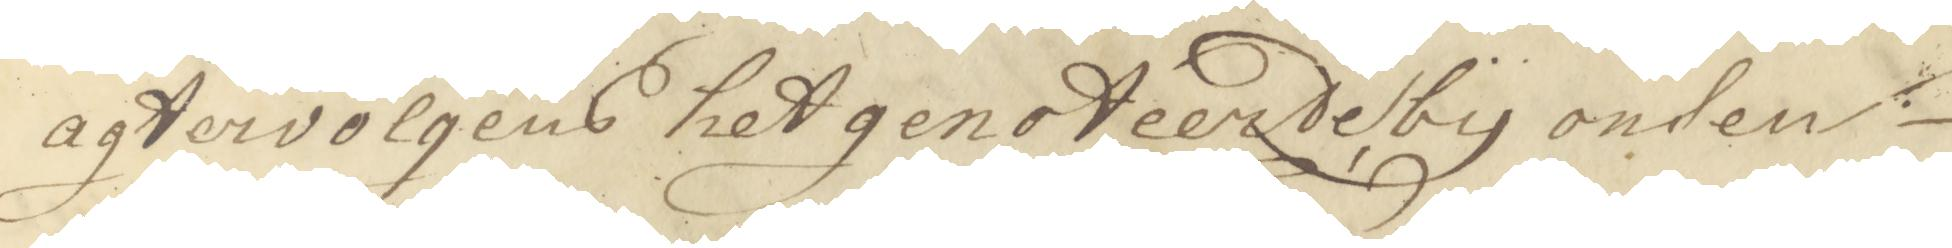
agtervolgens het genoteerde bij onsen
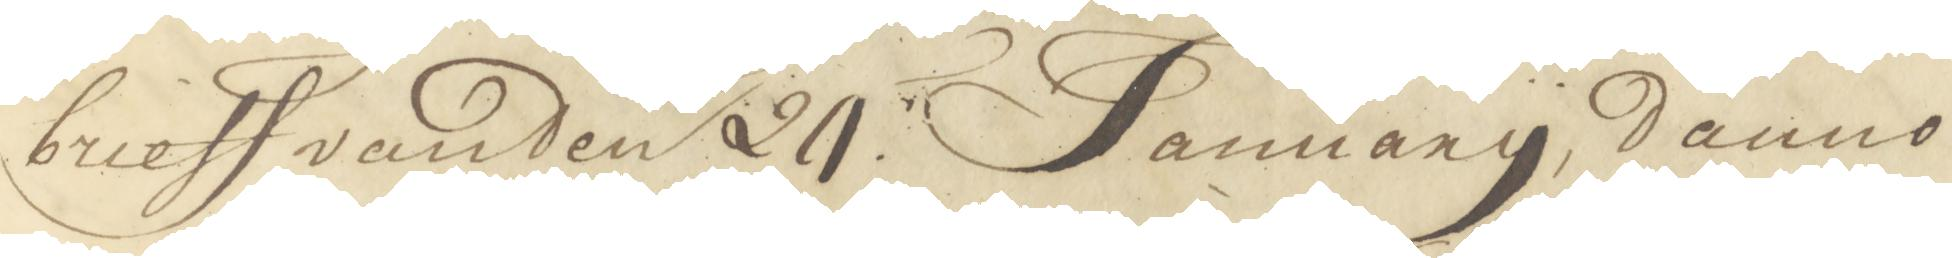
brieff van den 24:' Ianuarij, d'anno
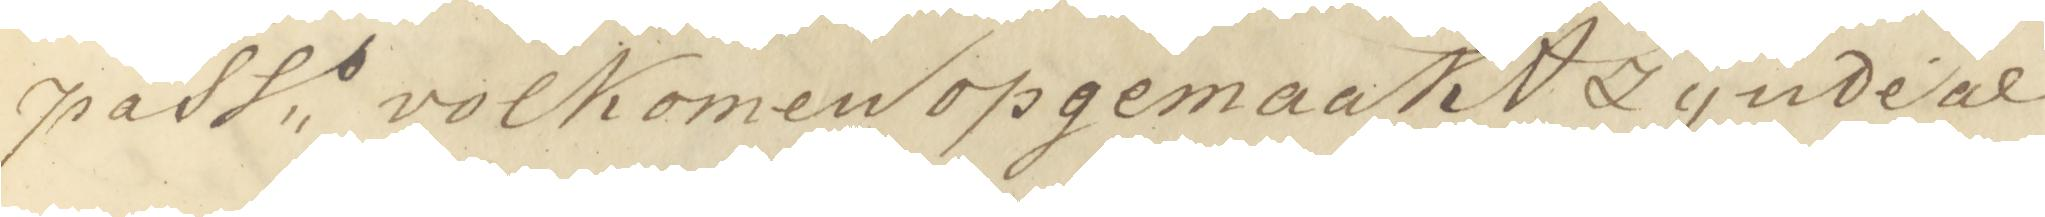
pass„o volkomen opgemaakt zijnde al
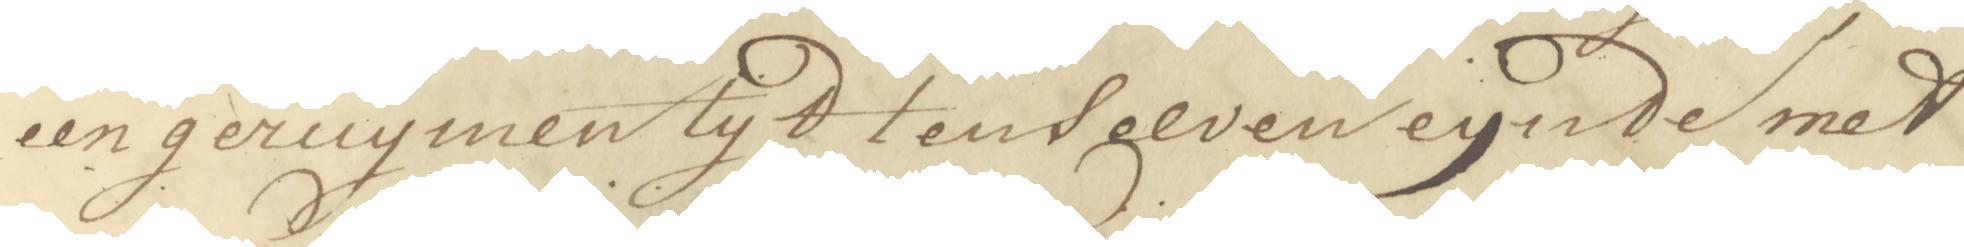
een geruijmen tijd ten selven eijnde met
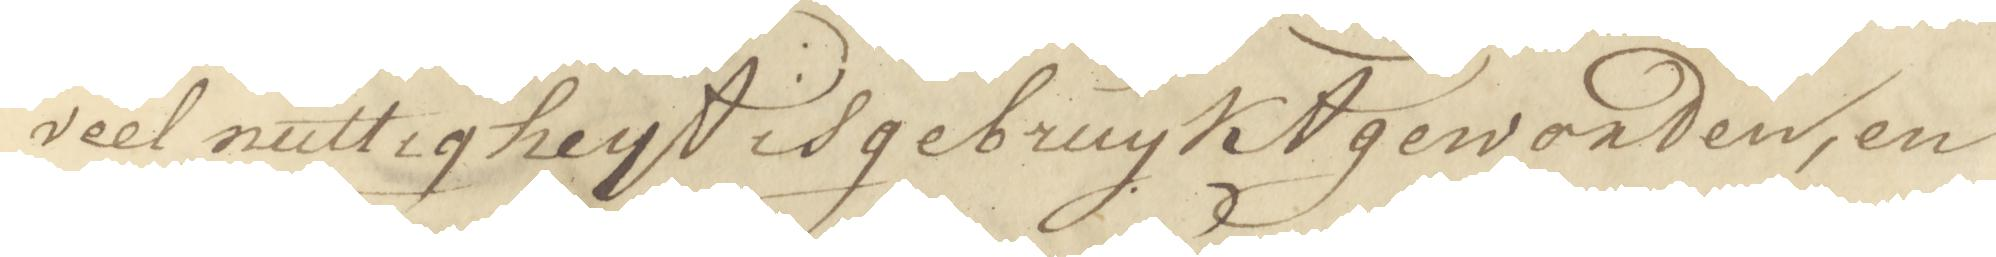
veel nuttigheijt is gebruijkt geworden, en
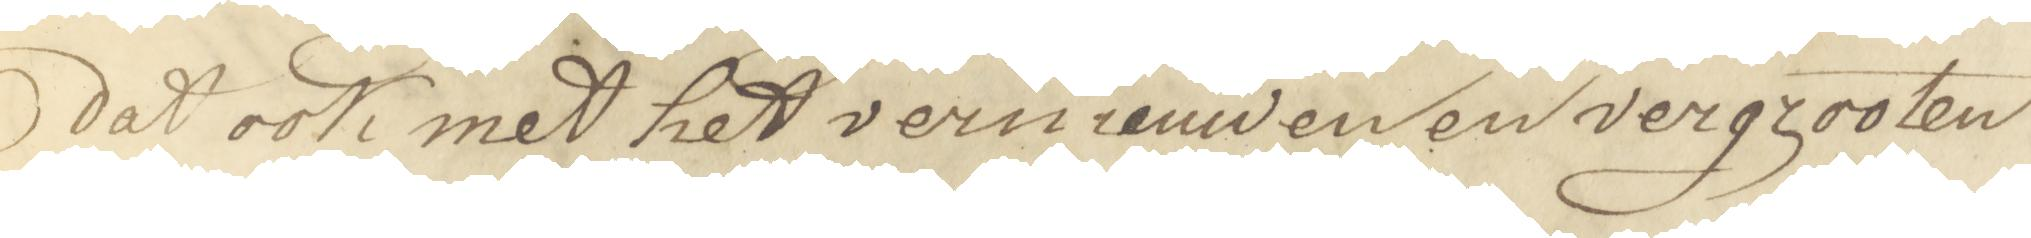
dat ook met het vernieuwen en vergrooten
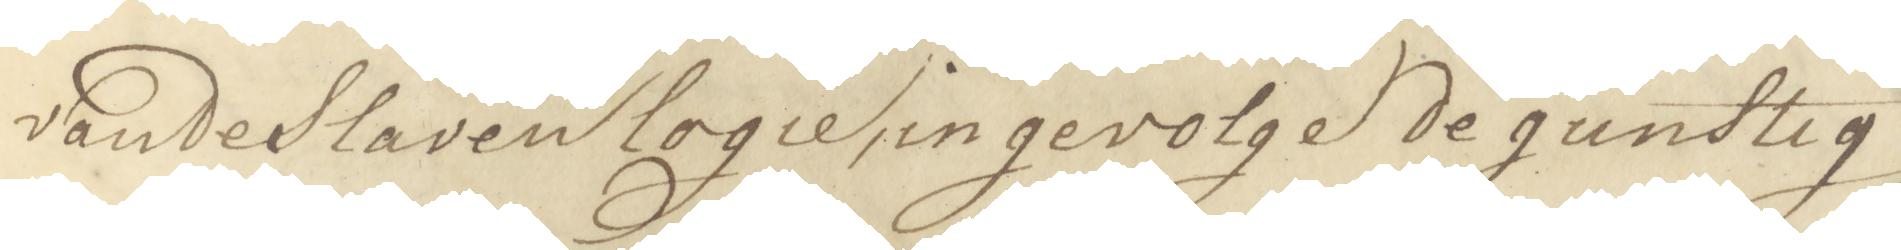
van de slaven logie, in gevolge de gunstig
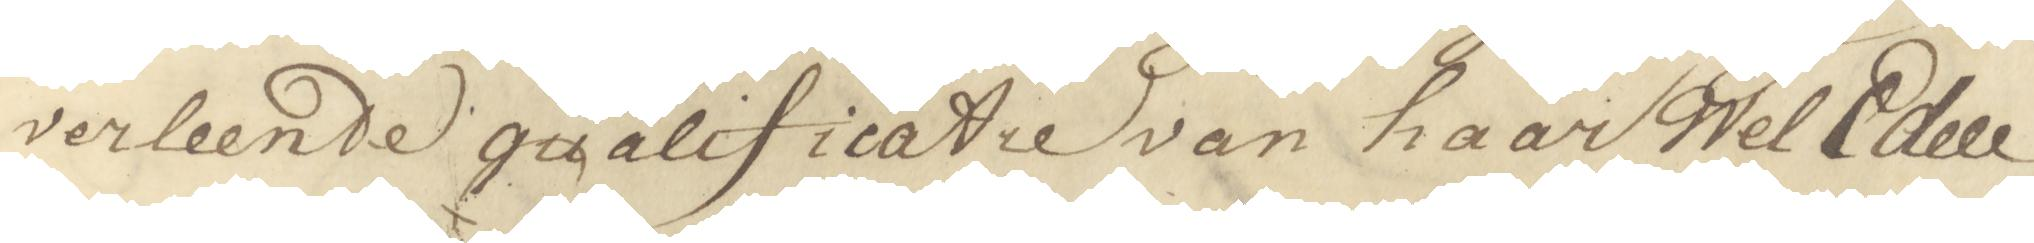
verleende qualificatie van haar wel Edele
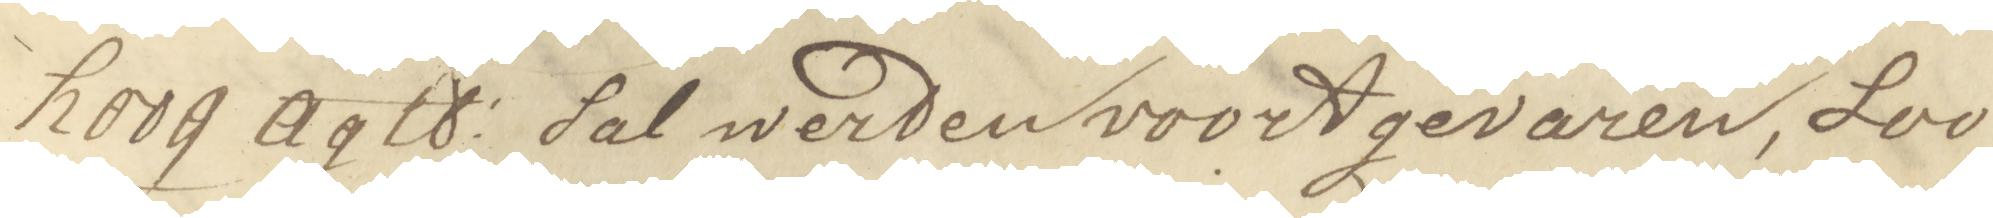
hoog agtb: sal werden voortgevaren, soo
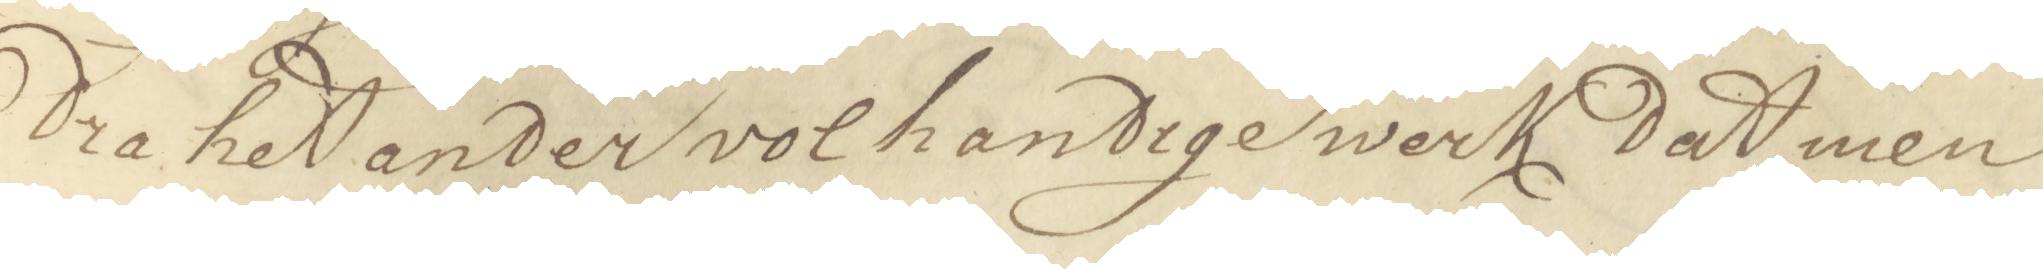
dra het ander volhandige werk dat men
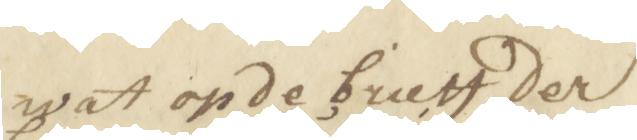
wat op de brieff der
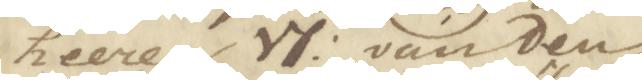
heeren 17:' van den
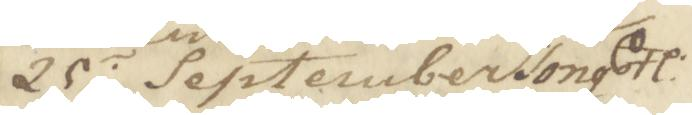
25:' September Iongstl:
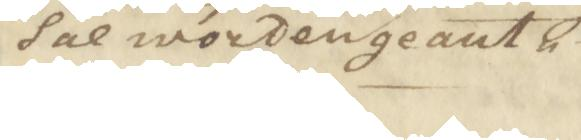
sal worden geant„
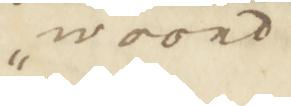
woord
